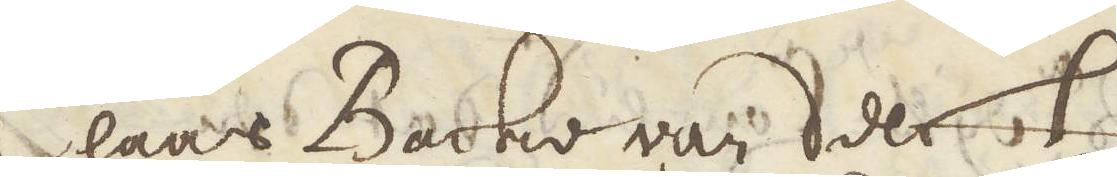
Claas Backe van delft
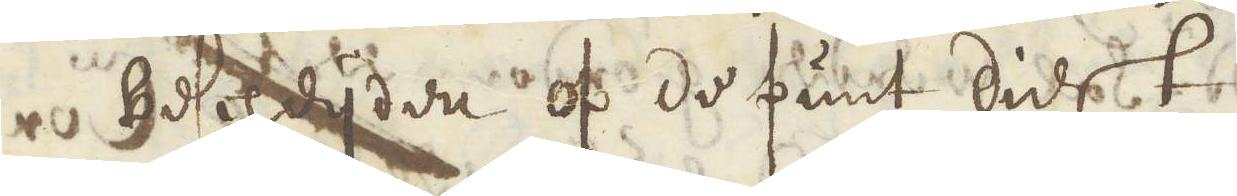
bescheijden op de punt diest
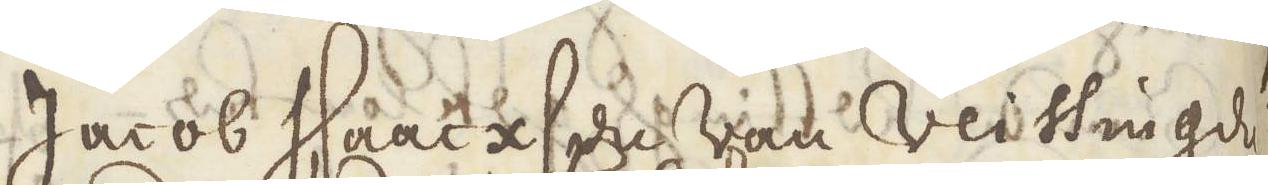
Jacob Jsaacxsen van Vlissingen
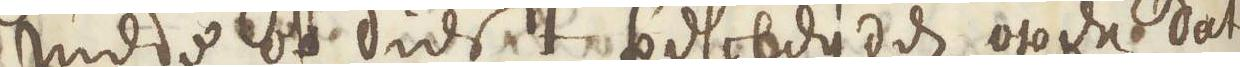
mede op diest bescheijden over dat
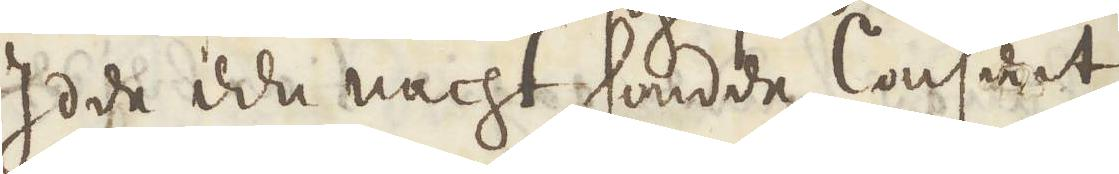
sij Jder een nacht sonder Consent
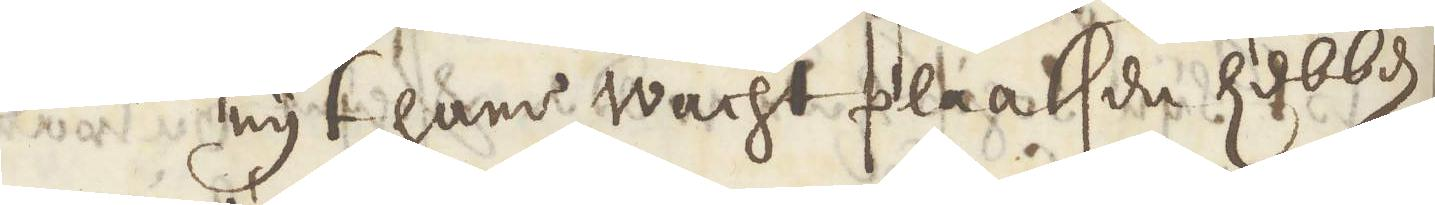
uijt hunne wacht plaatsen hebben
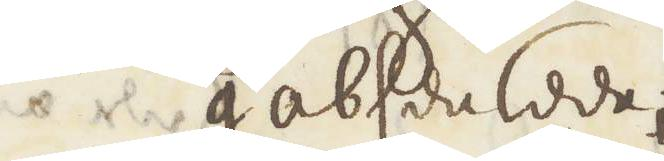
g'absenteert
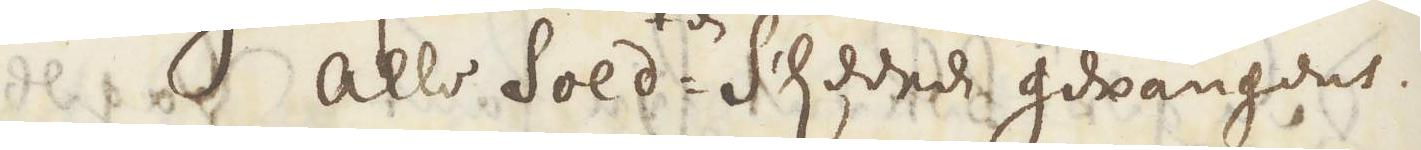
alle sold=ten S'heeren gevangens.
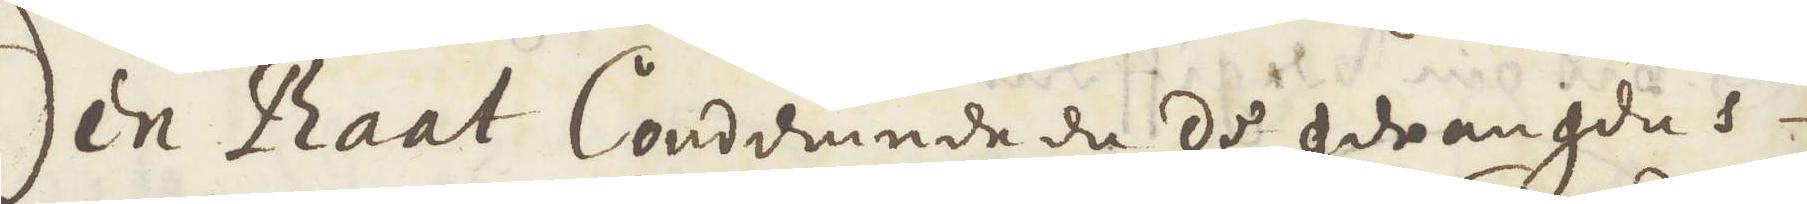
Den Raat Condemmneren de gevangens -
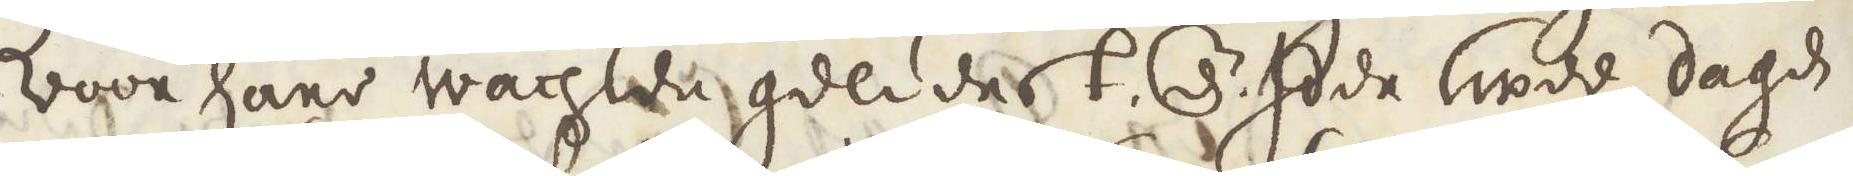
voor hare wachten geleerst, ende Jder twee dagen
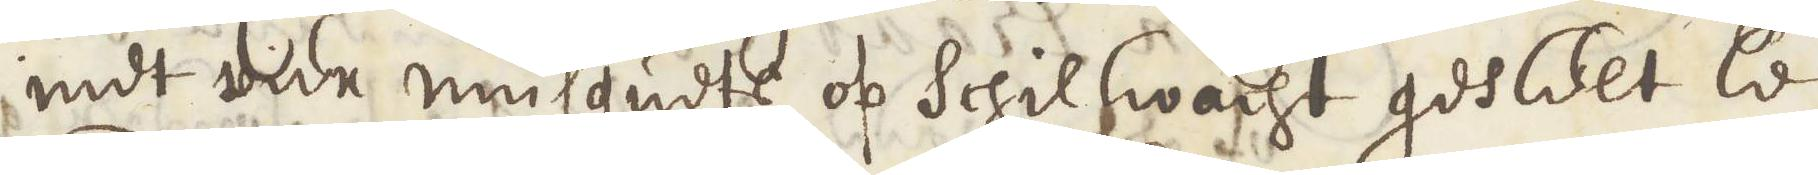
met vier musquets op schiltwacht gestelt te
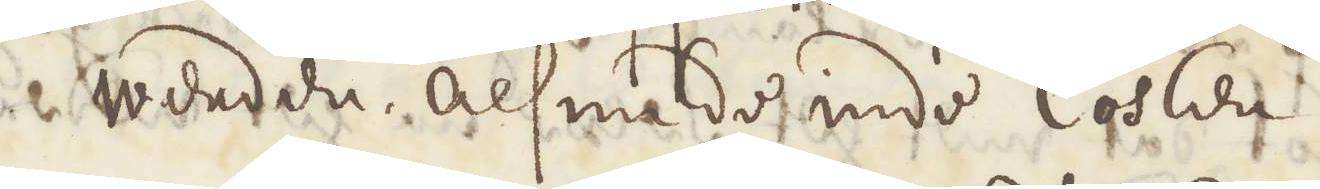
werden. alsmede inde Costen
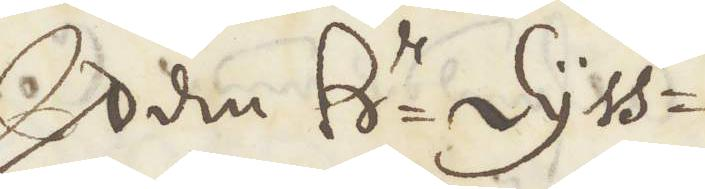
Jdem H=r Eijss=r
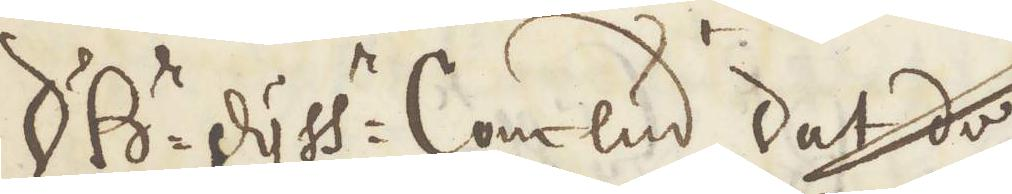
D' H=r eijss=r Concludt dat de
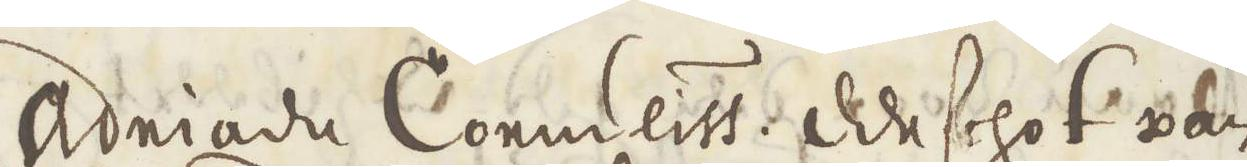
Adriaen Corneliss. Eerschot van
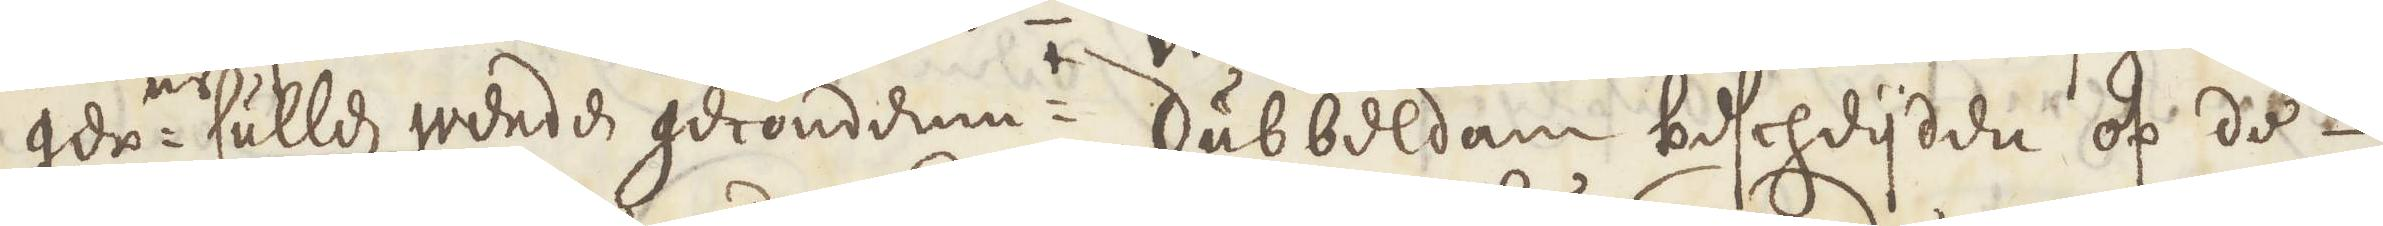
gev=ns sullen werden gecondemn=t dubbeldam bescheijden op de —
